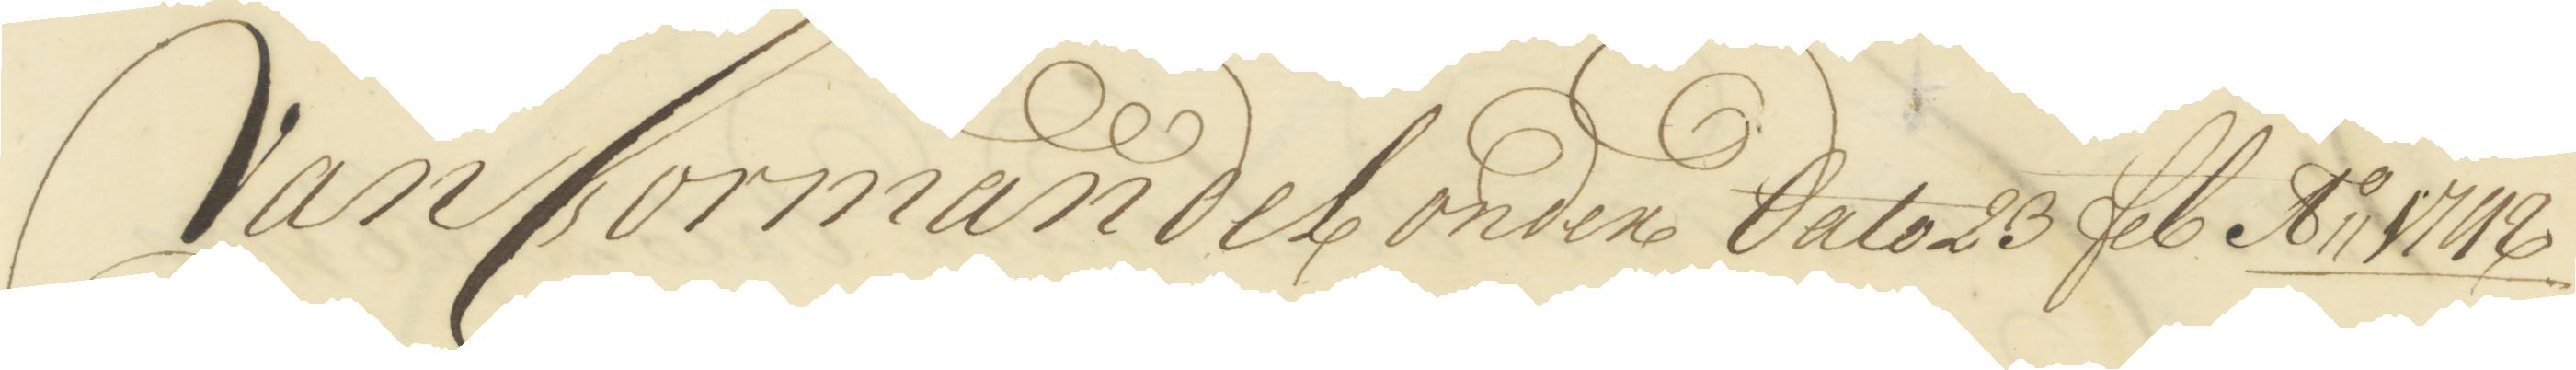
Van Cormandel onder dato 23 feb A„o 1742
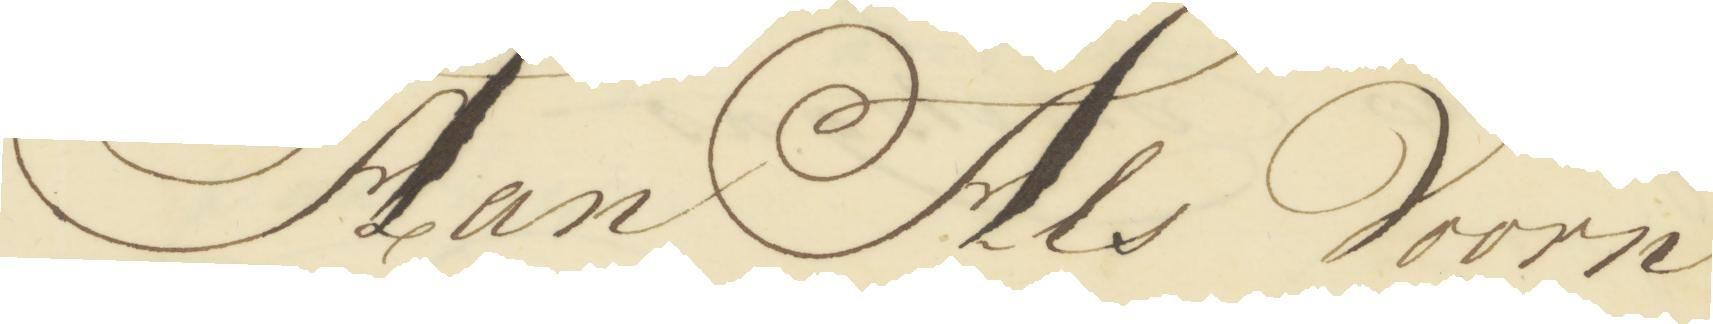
Aan Als Voorn
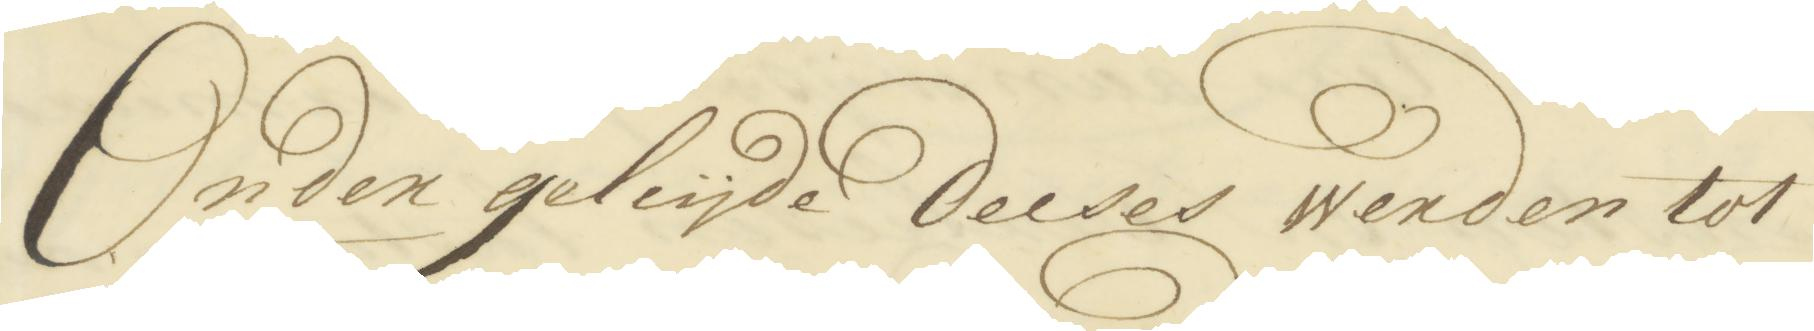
Onder geleijde deeses werden tot
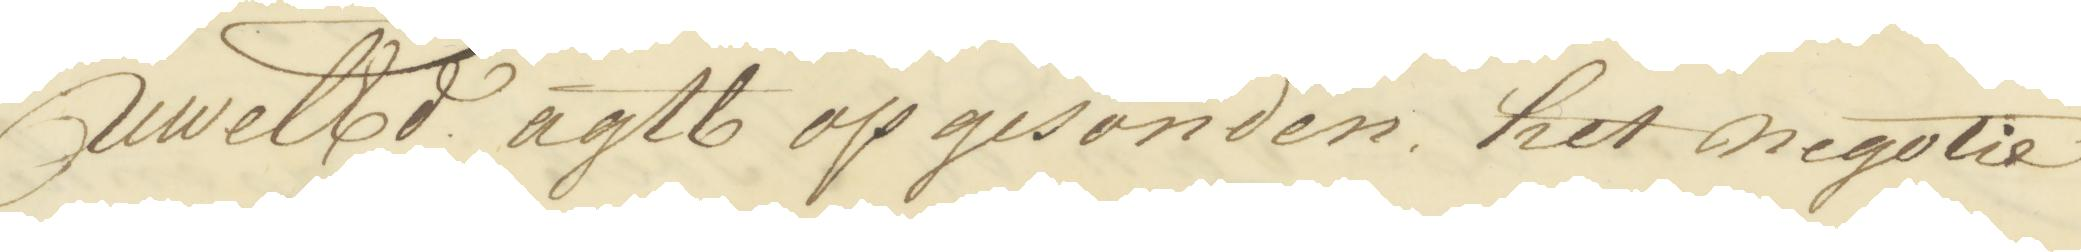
uwelEd agtb op gesonden het negotie
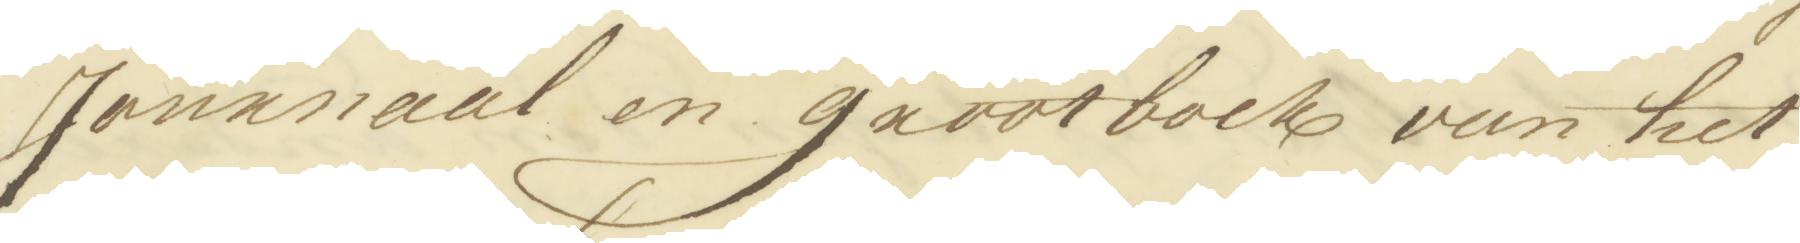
Journaal en grootboek van het
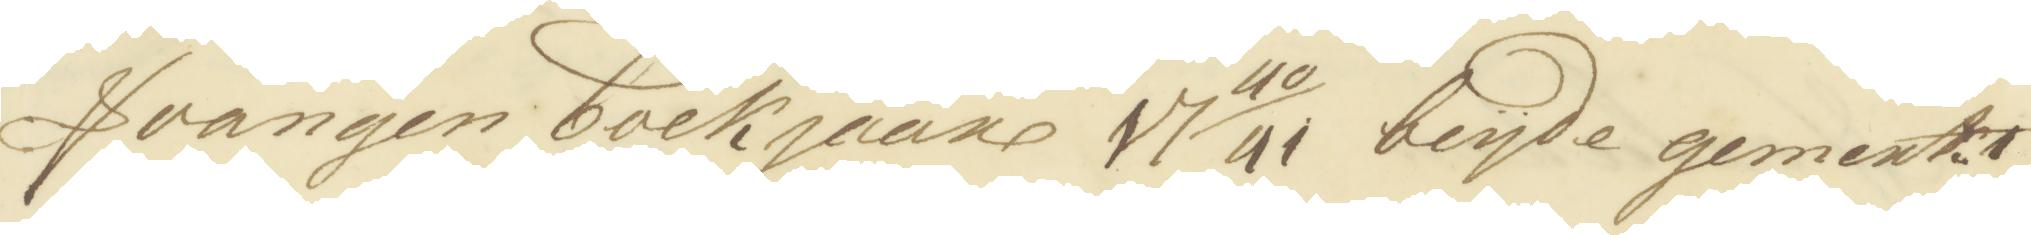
vervangen boekjaar 1740/41 beijde gemerkt
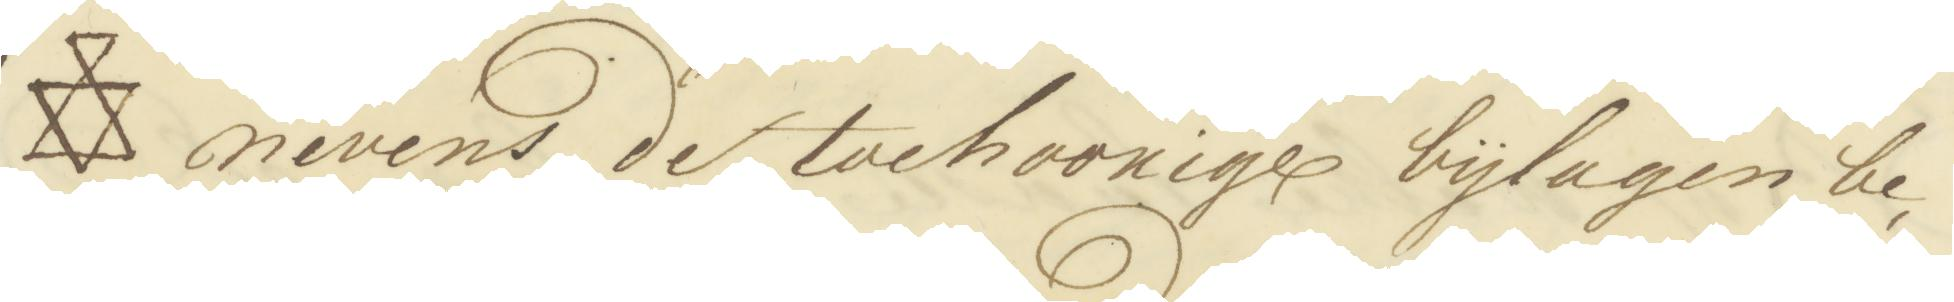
nevens de toehoorige bijlagen be,
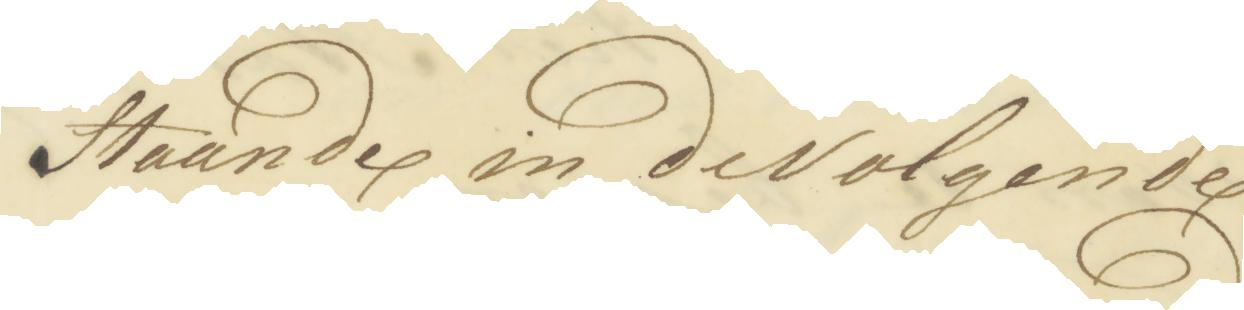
staande in de volgende
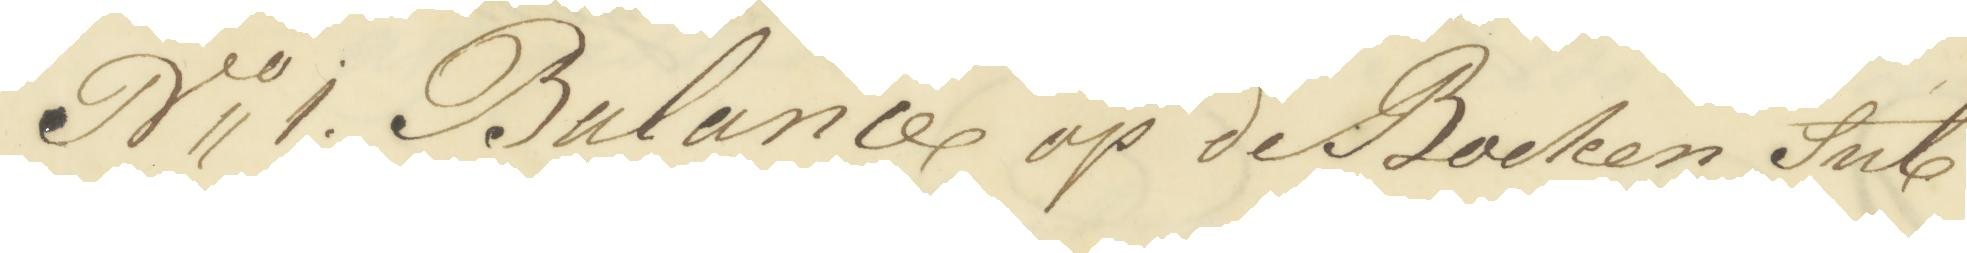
N„o 1. Balance op de Boeken sub
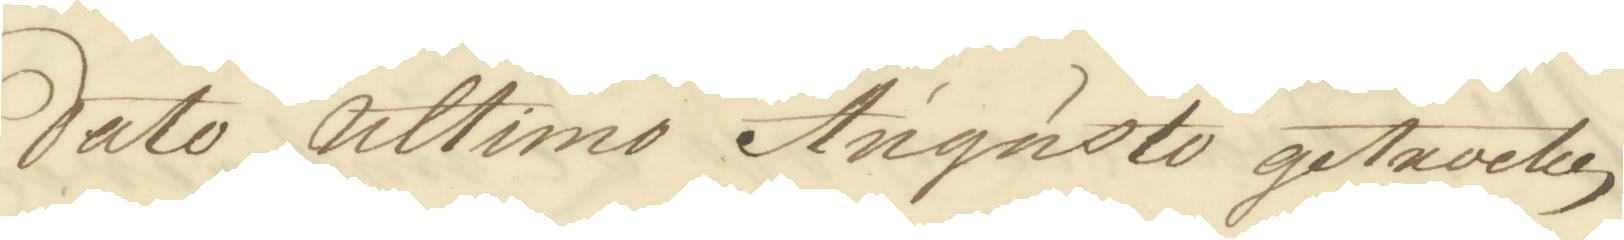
dato ultimo Augusto getrocken
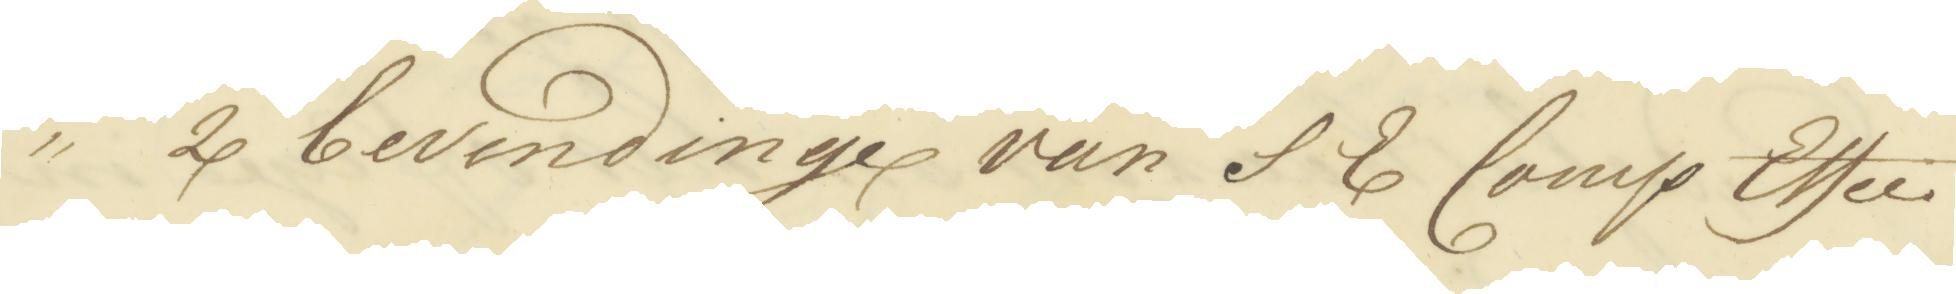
„ 2 bevindinge van s E Comp Effec
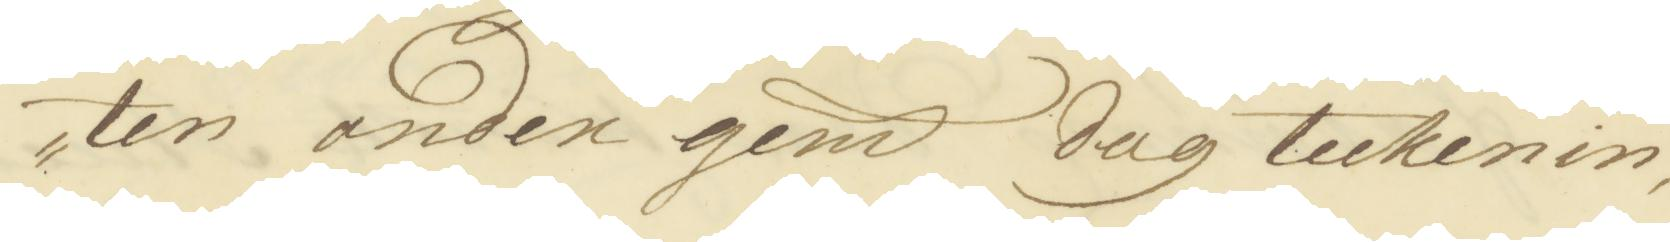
„ten onder gem dag teekenin,
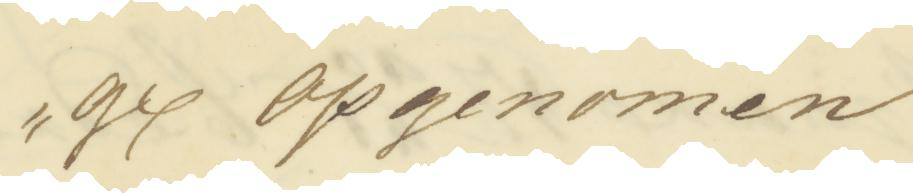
„ge opgenomen
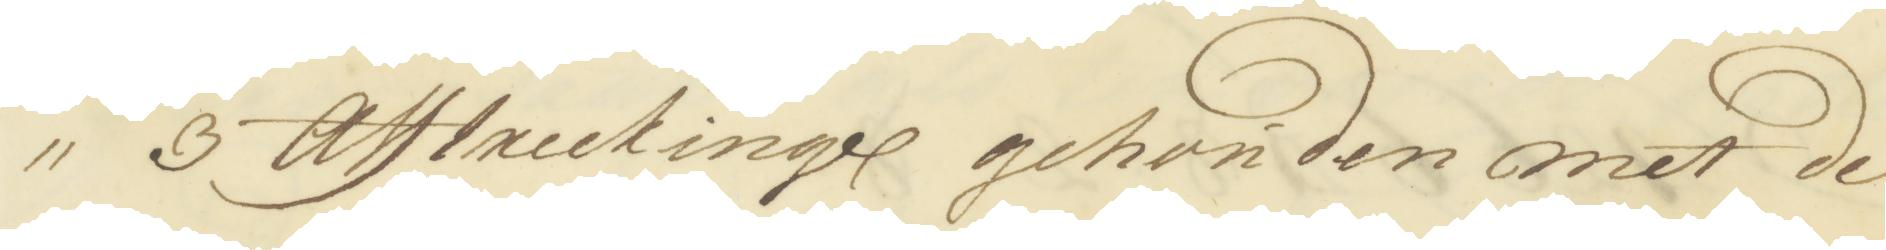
„ 3 Afftreckinge gehouden met de
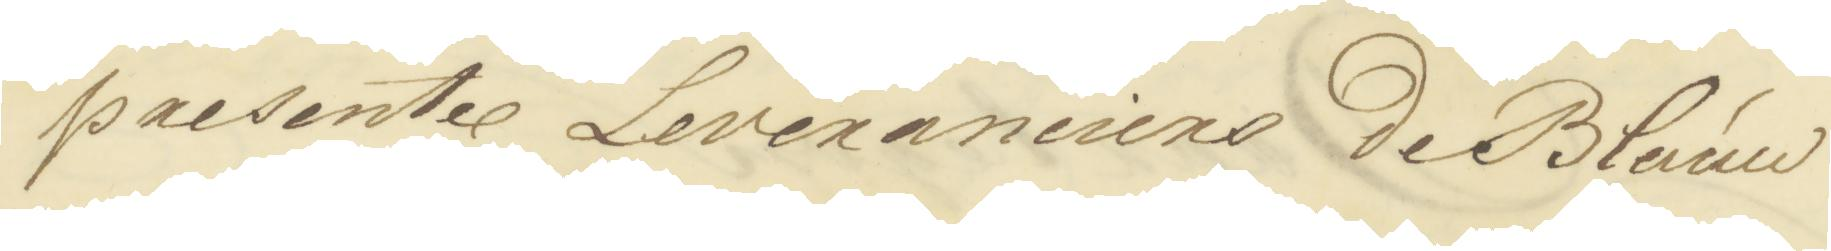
presente Leveranciers de Blauw
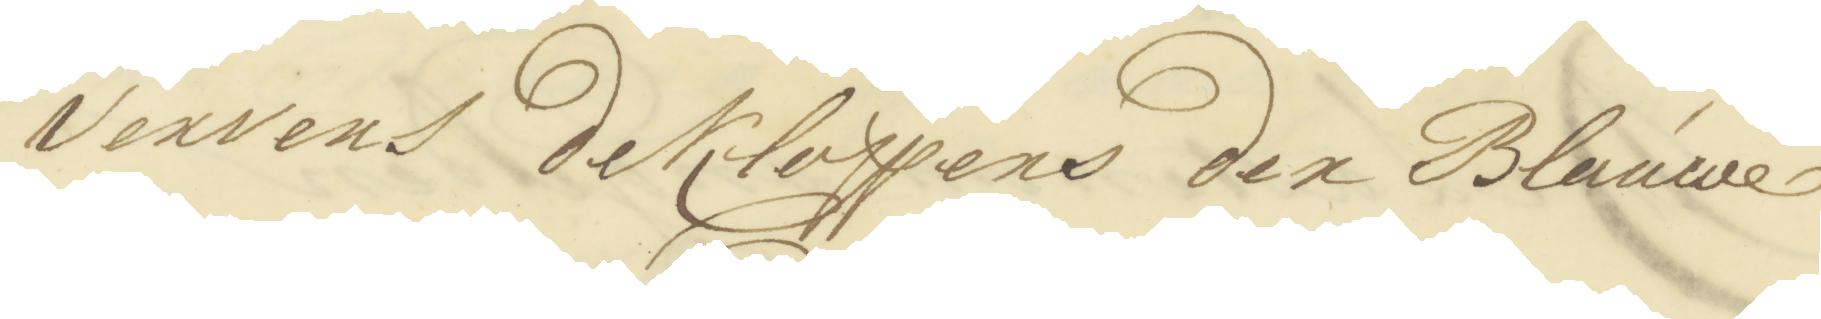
ververs de kloppers der Blauwe
